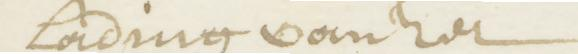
lading van het
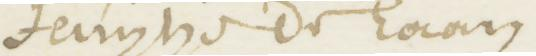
fluijtje de haan
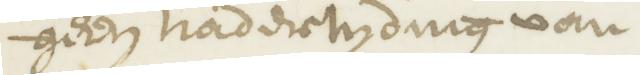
geen nadertijding van
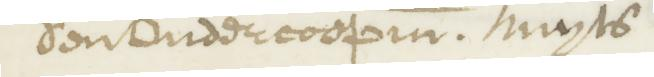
den Ondercoopm. Nuijts
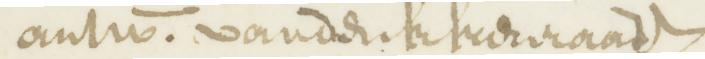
antw. vanden kkenraad
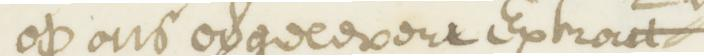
op ons overgelevert Extract
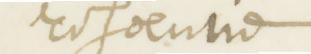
resolutie
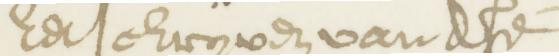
het schrijven van dese
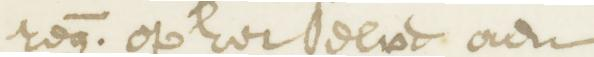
reg. op het selve aen
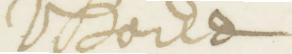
VHoEd
